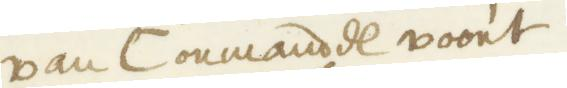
van Cormandel voor’t
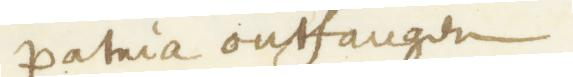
patria ontfangen
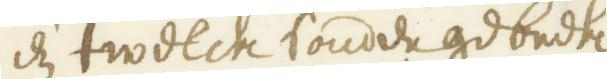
en 'twelck sonder gebrek
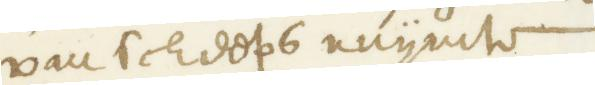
van scheeps ruijmte
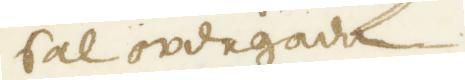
sal overgaen
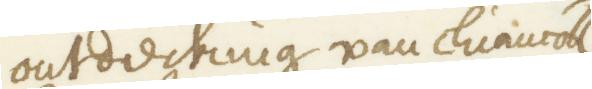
ontdecking van chiancos
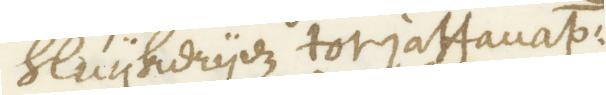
sluijkerijen totjaffanap:
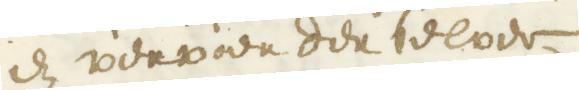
en vervoer der selver
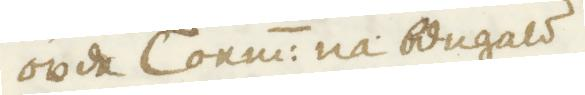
over Corm: na bengale
